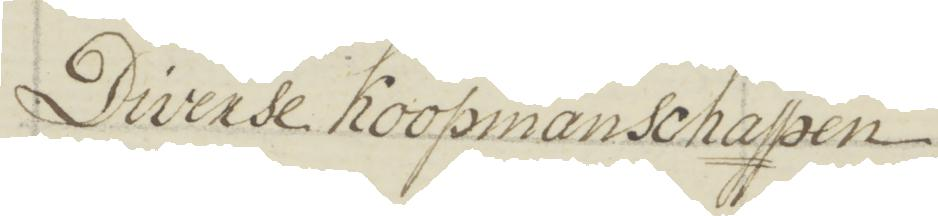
Diverse koopmanschappen
